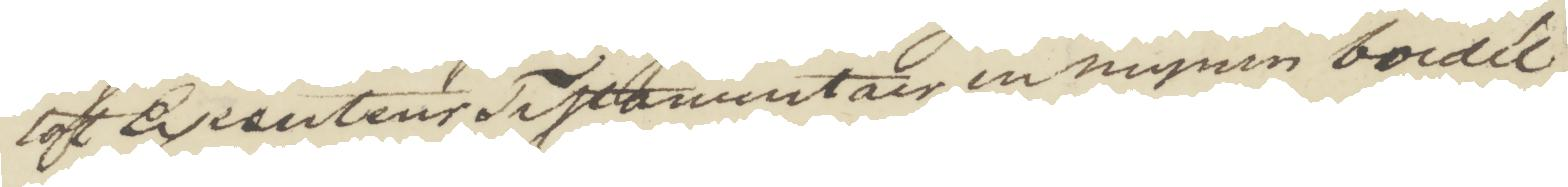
tot Executeur Testamentair in mynen boedel
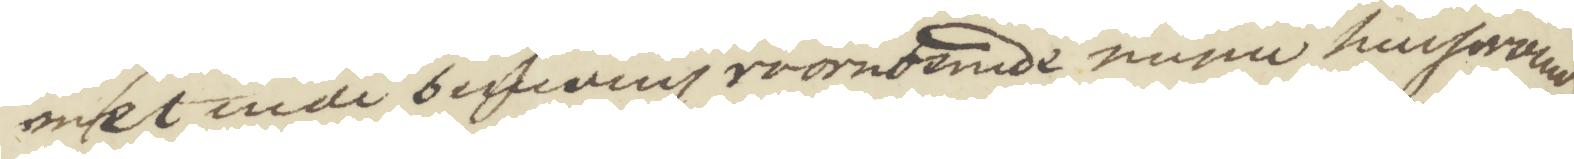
met ende benevens voornoemde myne huisvrouw
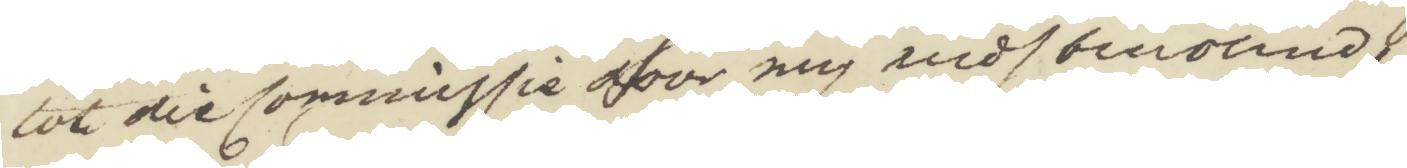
tot die Commissie door my reeds benoemd,
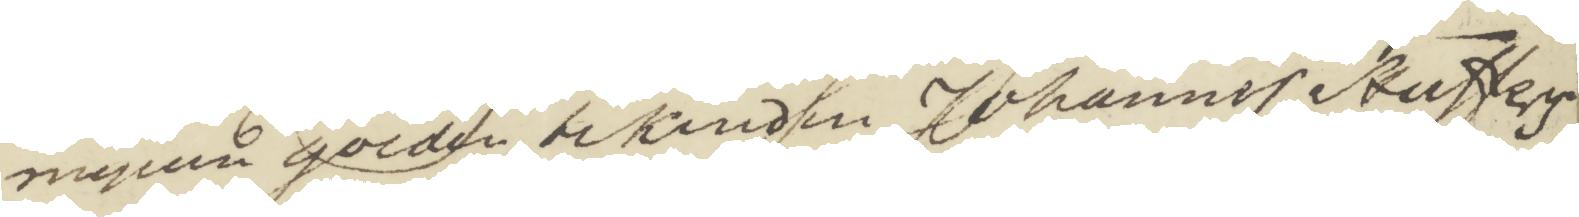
mynen goeden bekenden Johannes Stuffers
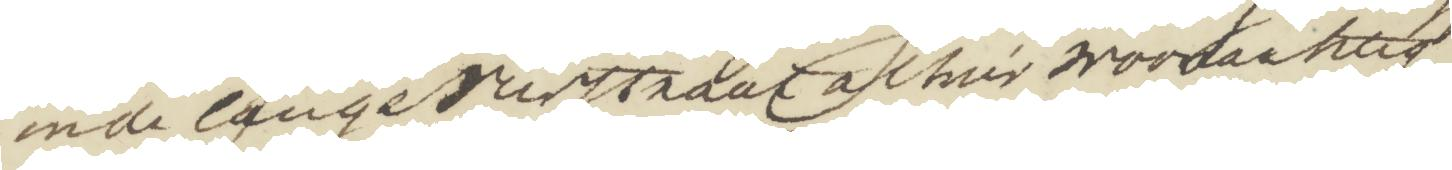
in de lange veerstraat alhier woonachtig
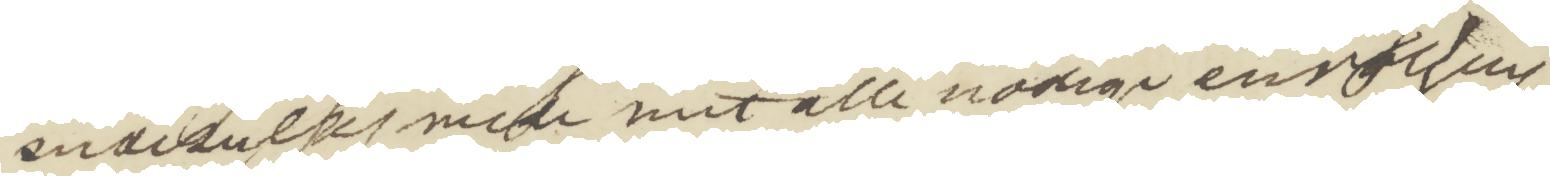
en dezulks mede met alle nodige en volgens
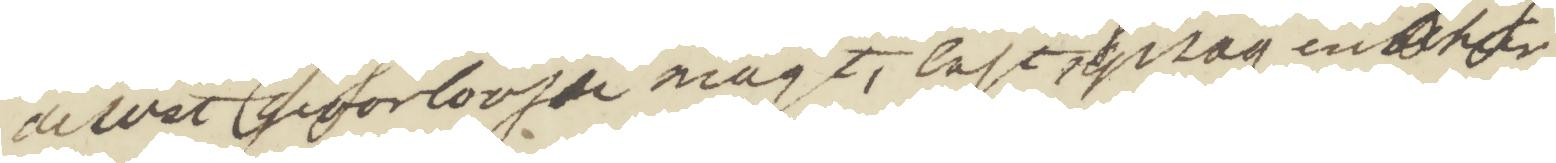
de wet Geoorloofde magt, last, gezag en beheer
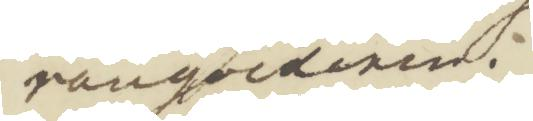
van goederen.
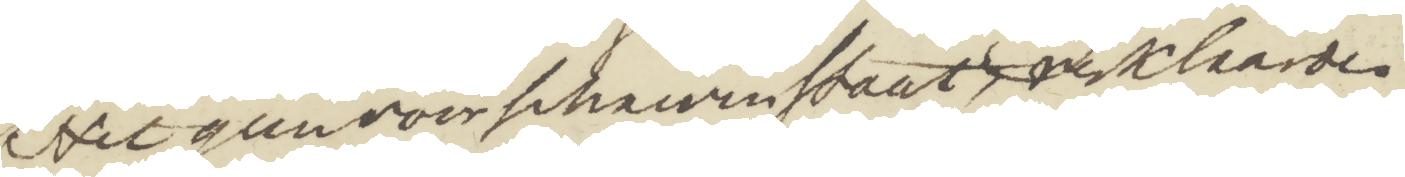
Het geen voorschreven staat, verklaarde
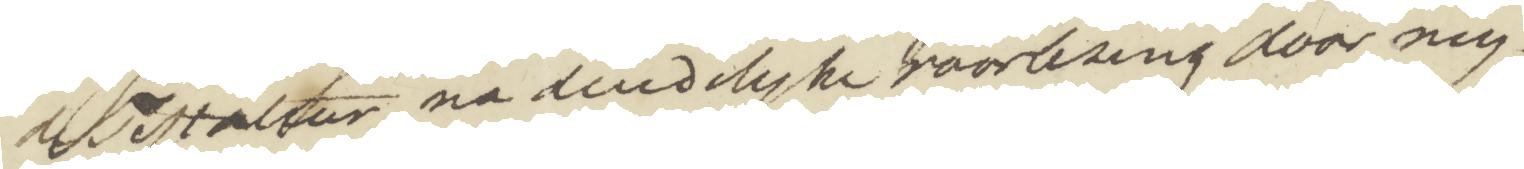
de Testateur na duidelyke voorlezing door my
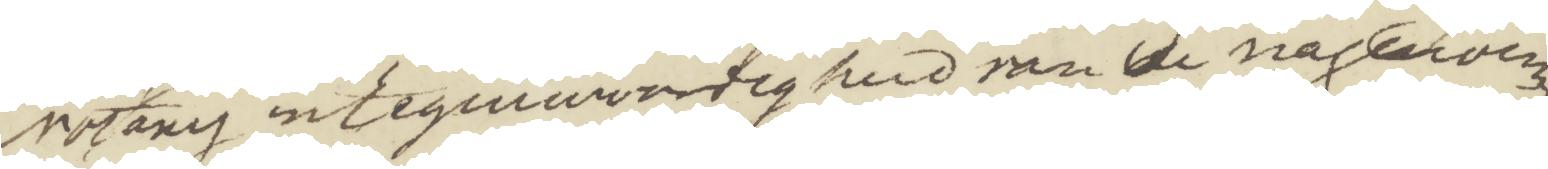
notaris integenwoordigheid van de nagenoem
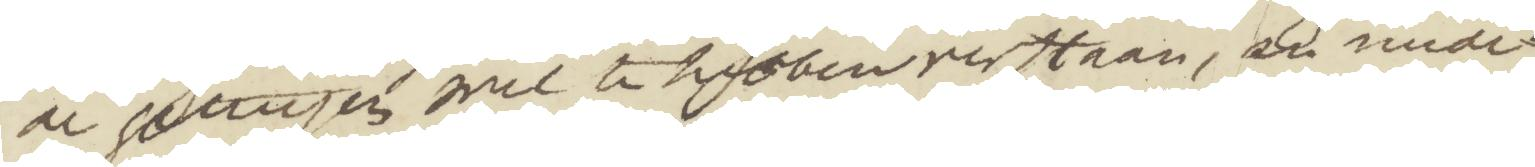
de getuigen wel te hebben verstaan, en mede
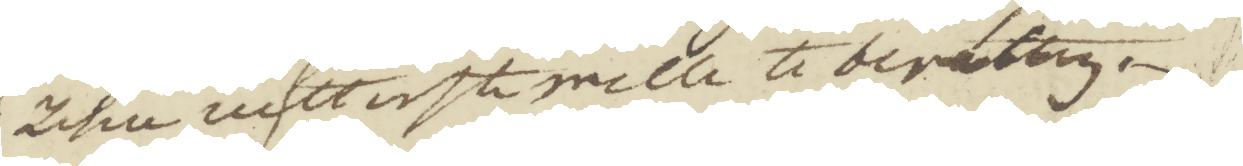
zyn uitterste wille te bevatten.
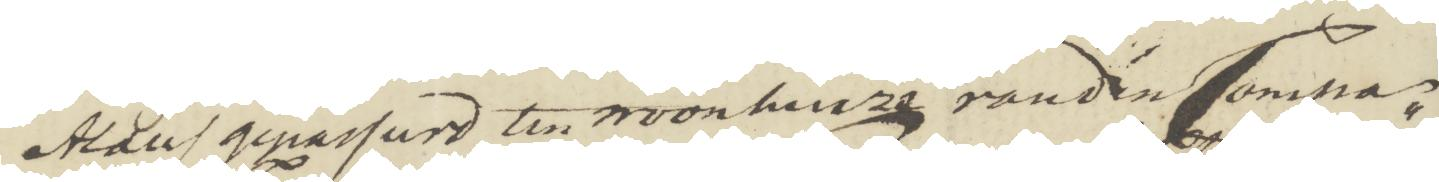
Aldus gepasseerd ten woonhuize van den Compa„
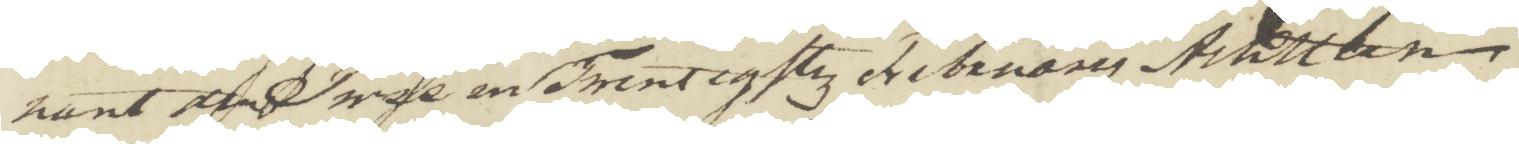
rant den Twee en Twintigsten February Achttien
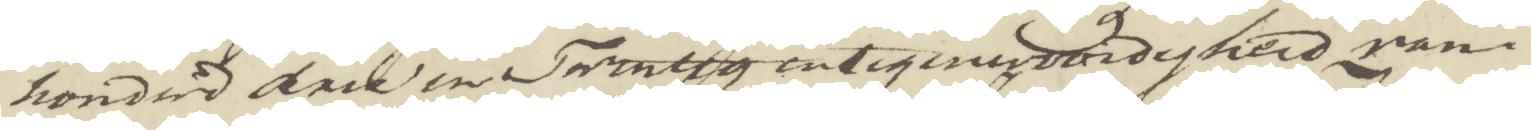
honderd drie en Twintig integenwoordigheid van
